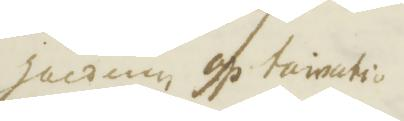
Goederen op tauxatie
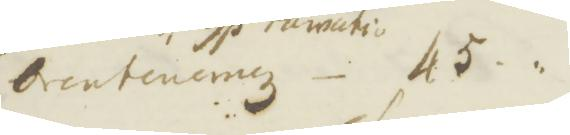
Overtenemen — 45 . „
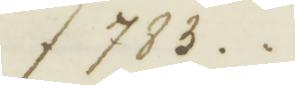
ƒ 783.
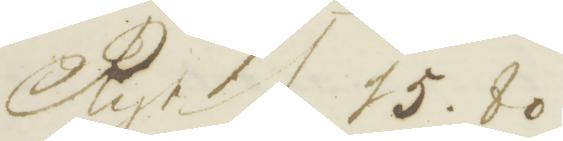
Ryk. ƒ 15.80
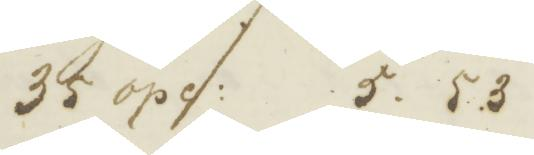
35 opc: 5. 53
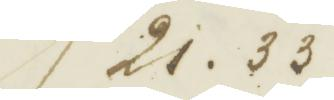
ƒ 21. 33
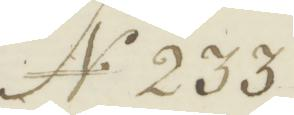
No 233
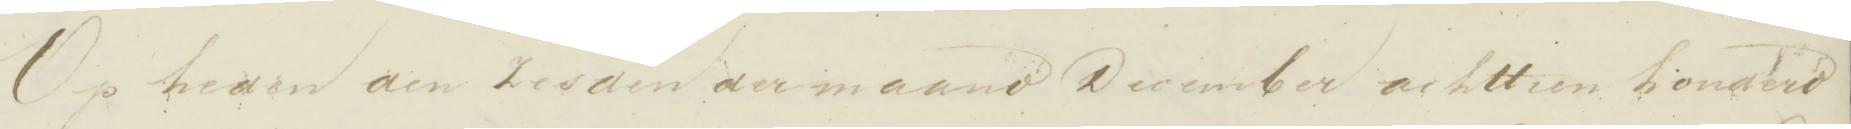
Op heden den zesden der maand December achttien honderd
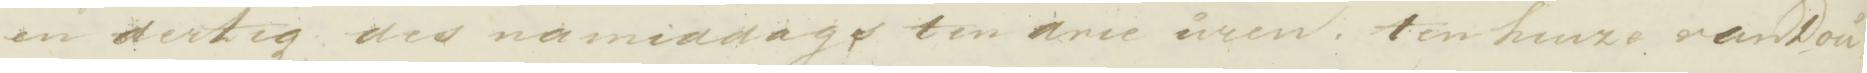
en dertig des namiddags ten drie uren, ten huize van Dou
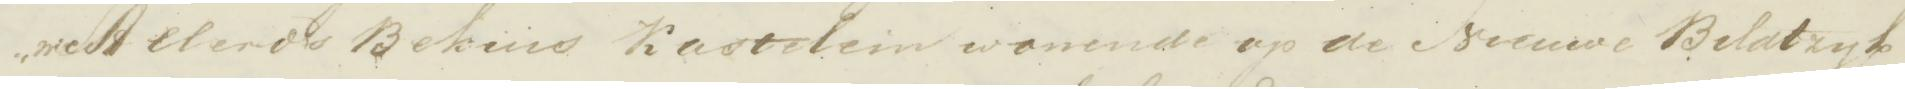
„we Allerds Bekius kastelein wonende op de Nieuwe Bildtzyl
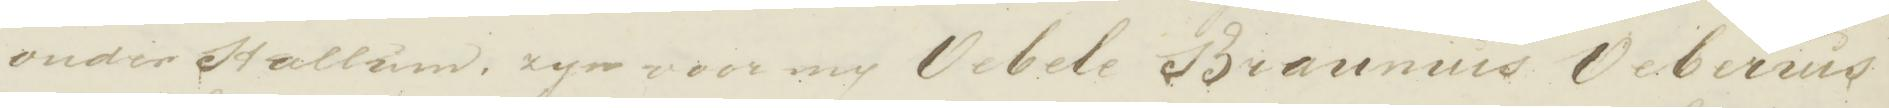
onder Hallum, zyn voor my Oebele Braunius Oeberius
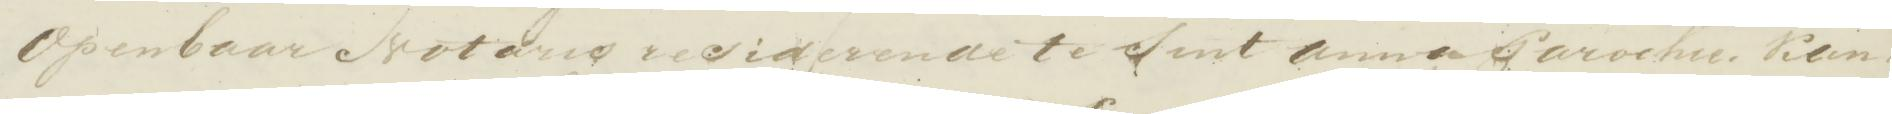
Openbaar Notaris residerende te Sint anna Parochie, kan
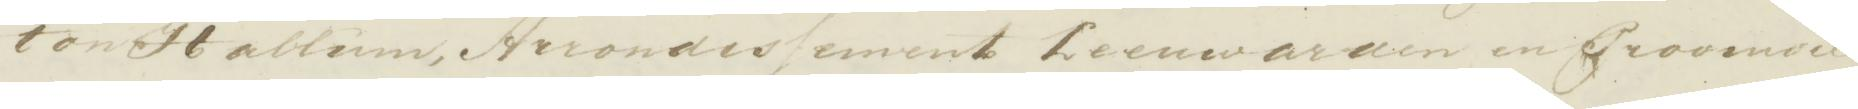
ton Hallum, Arrondissement Leeuwarden en Provincie
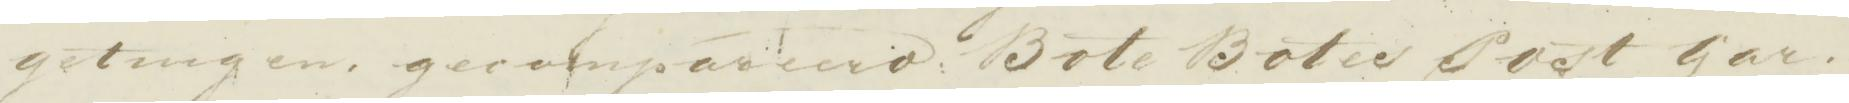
getuigen, gecompareerd: Bote Botes Post Gar,
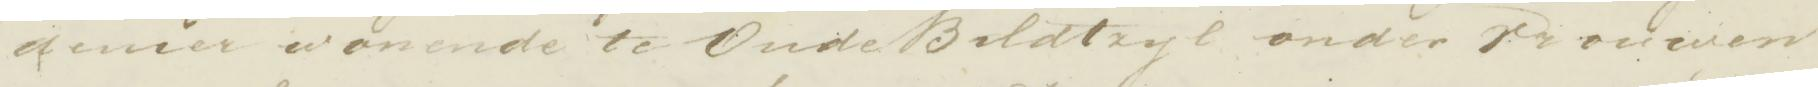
denier wonende te Oude Bildtzyl onder vrouwen
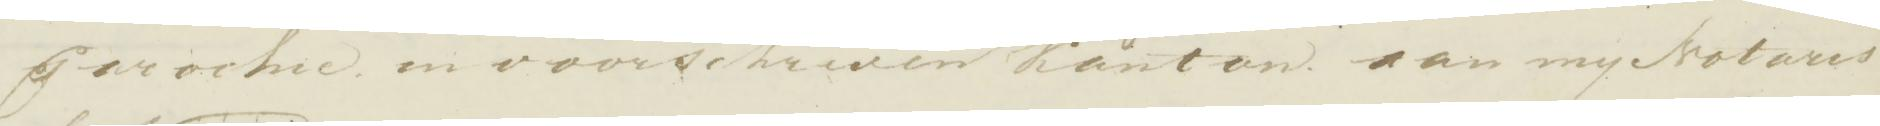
Parochie, in voorschreven kanton. aan my Notaris
